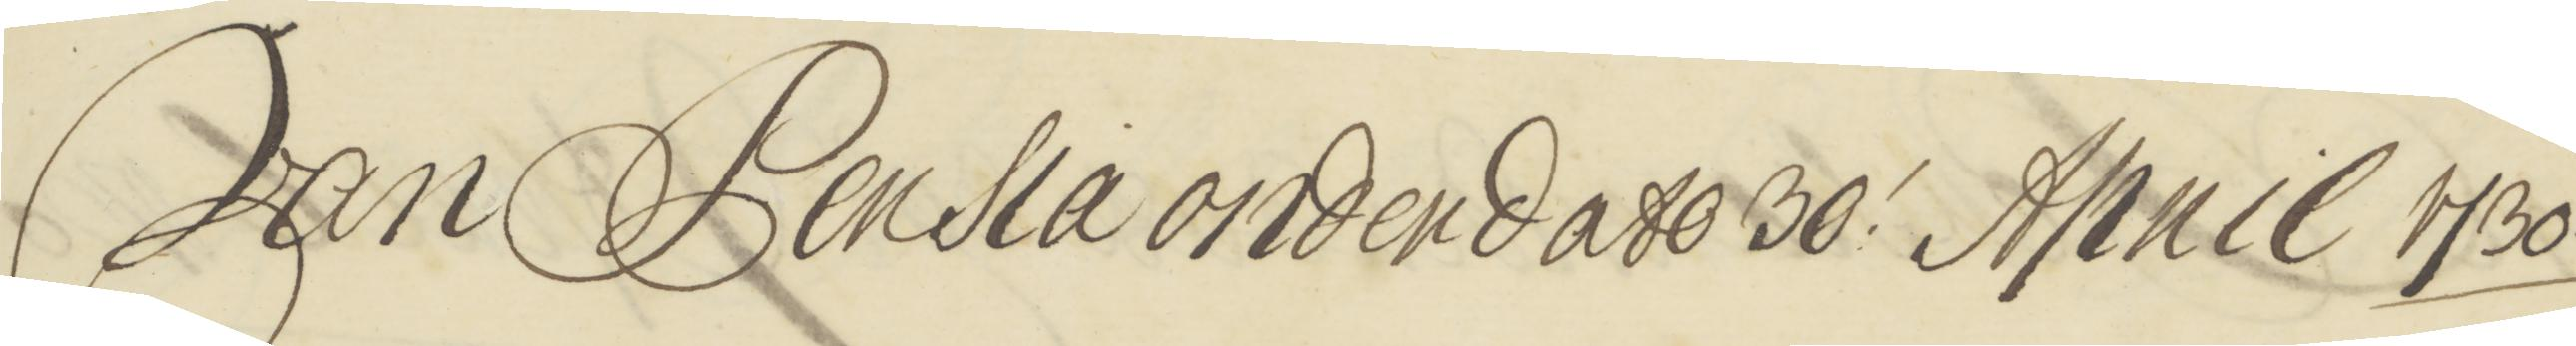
Van Persia onder dato 30:' April 1730
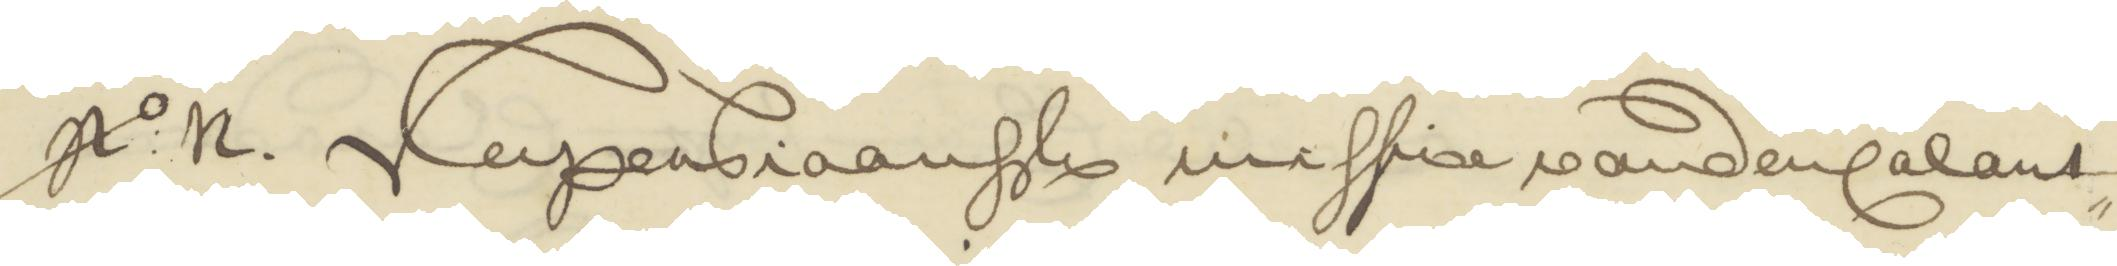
N:o 12. Een persiaansch missive van den Calant„
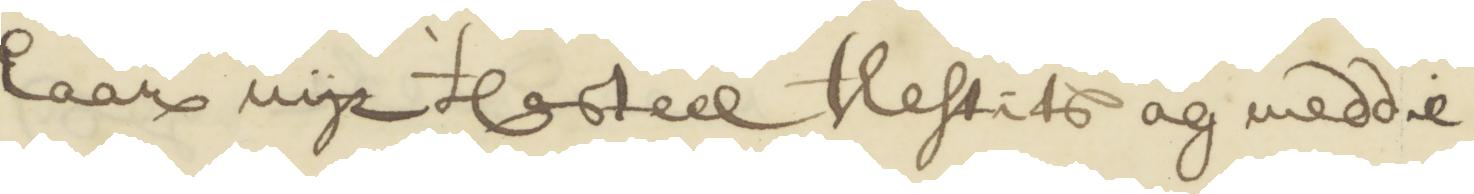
haar uijt 't Casteel thestits ag meddie
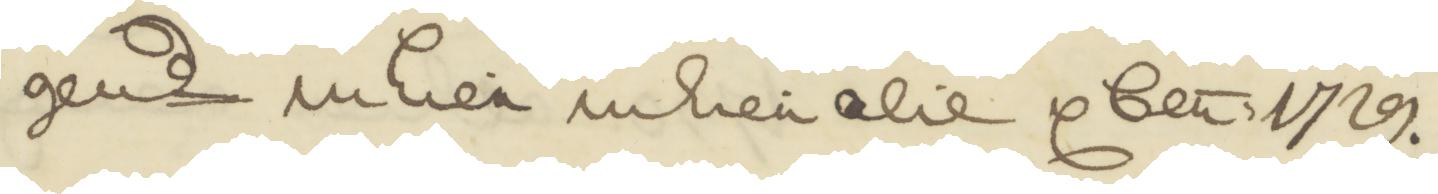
gen=d mhier mhier alie xber: 1729.
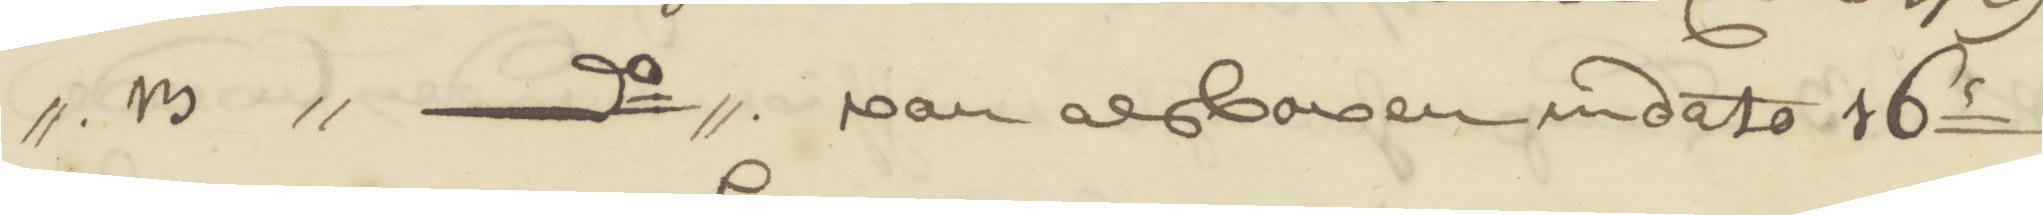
„ . 13 „ d=o„. van alsboven in dato 16='
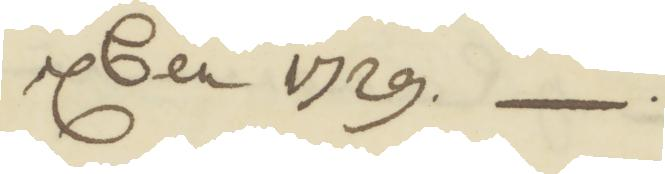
xber 1729. — .
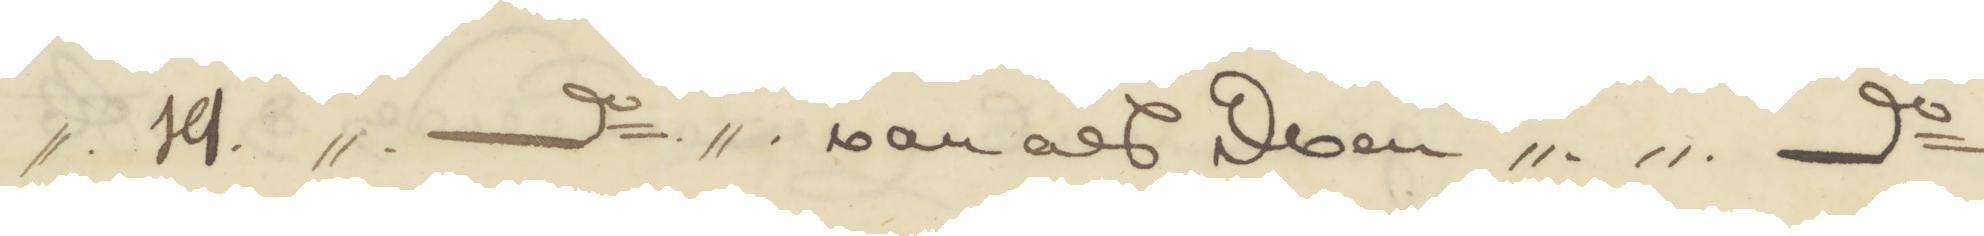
„ . 14. „ . d=o. „ . van als Even „. „. d=o
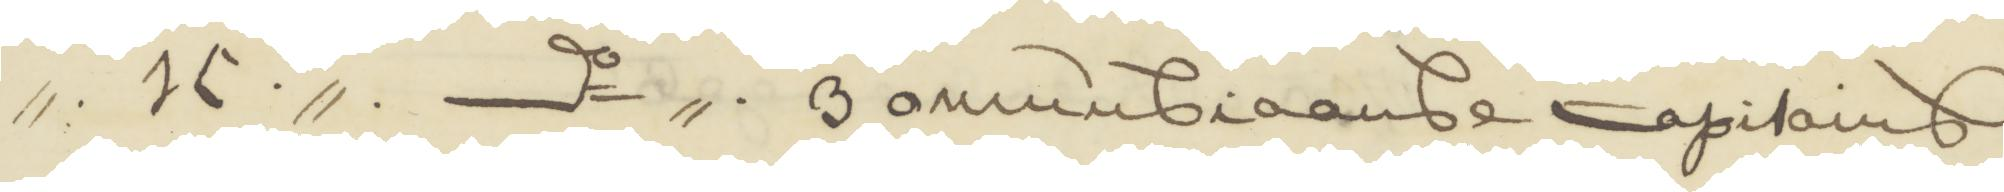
„. 15. „ . d=o „ . 3 ormusiaanse capitains
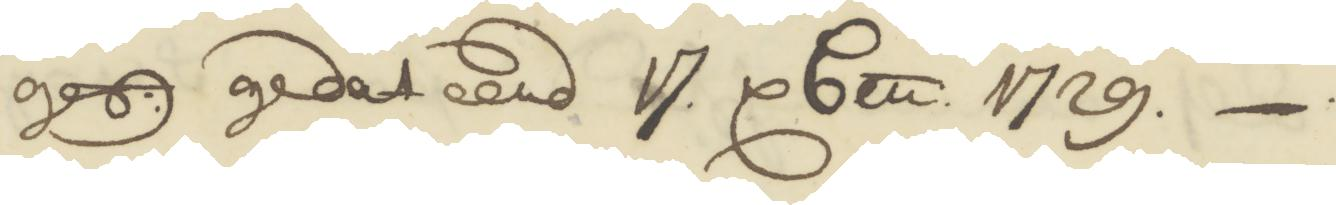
ges:z gedateerd 17. xber: 1729. — .
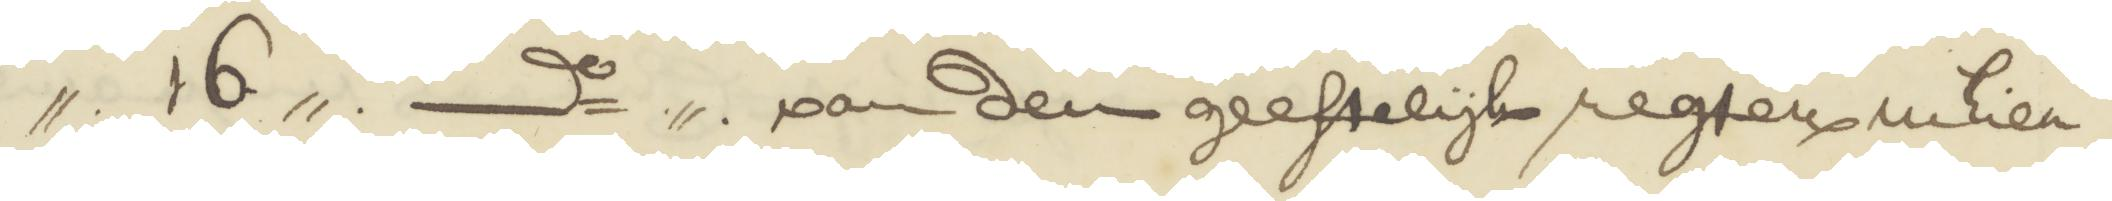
„ . 16 „ . d=o . „ . van den geestelijk regter mhier
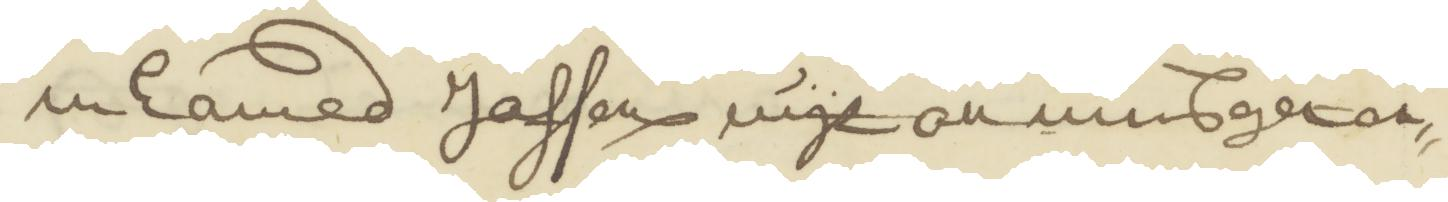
mhamed Jasser uijt ormus gecar„
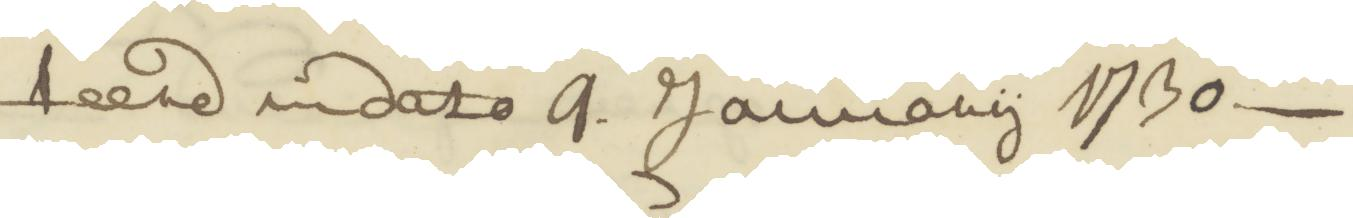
teerd in dato 4. Januarij 1730 —
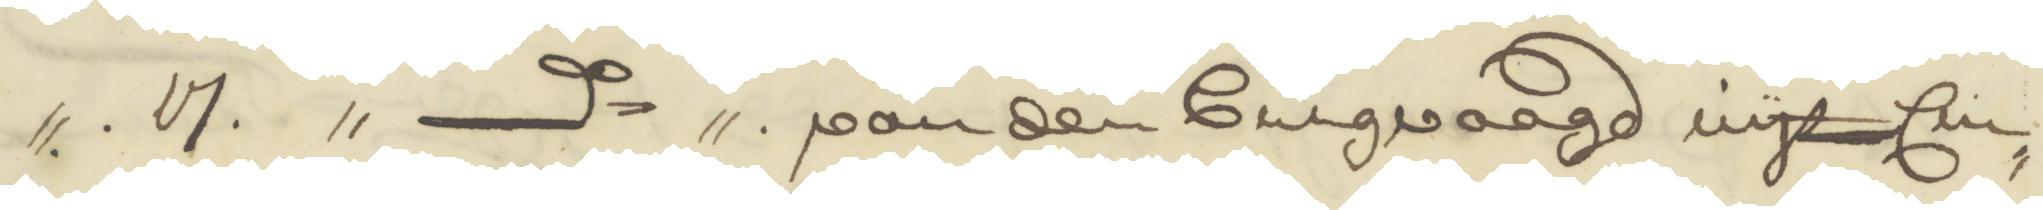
„ . 17. „ d=o „ . van den burgvoogd uijt Cin„
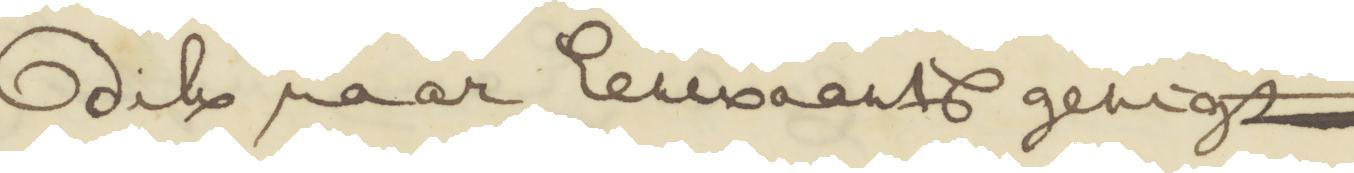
dik naar herwaarts gerigt
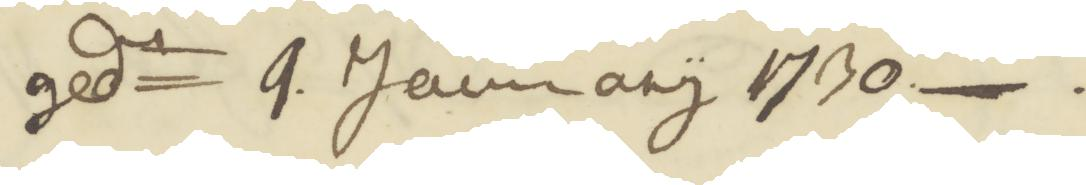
ged=t 4. Januarij 1730.— .
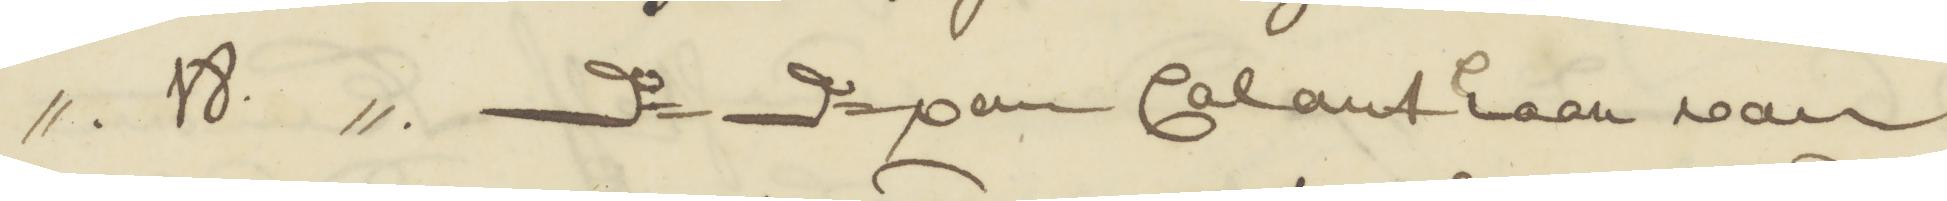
„ . 18 . „ . d=o d=o van Calanthaar van
